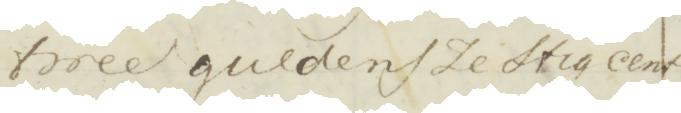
twee guldens Zestig cents
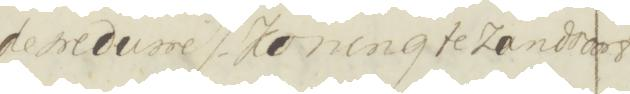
de weduwe J. Koning te Zandvoort
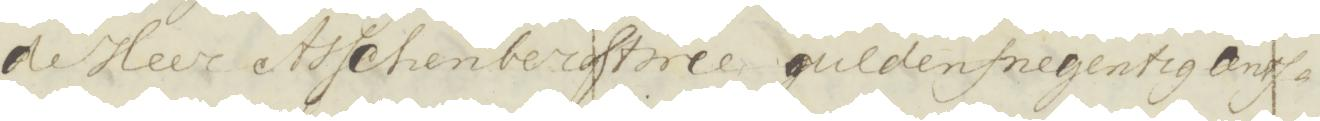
de Heer Asschenbergh twee gulden negentig cents
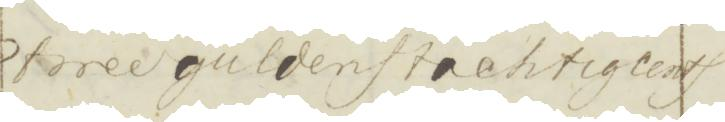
twee guldens tachtig cents
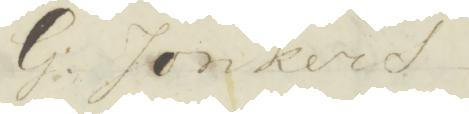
G: Jonkers
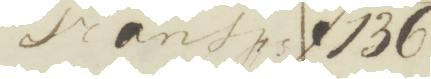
Transp: ƒ 236
